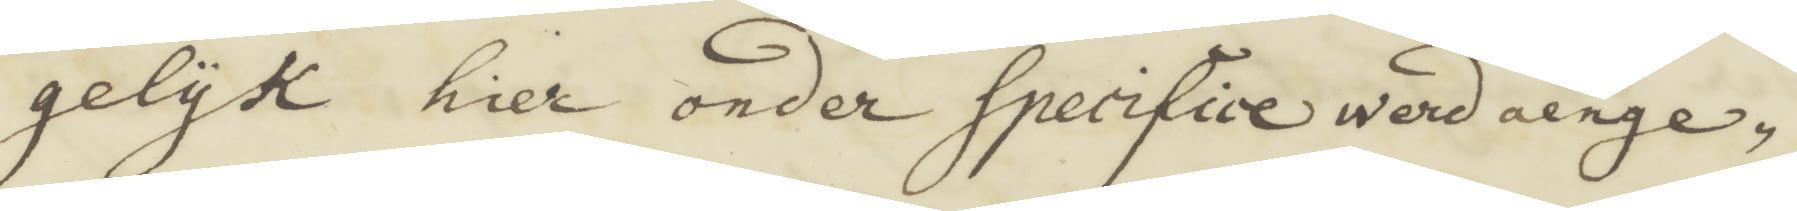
gelijk hier onder specifice werd aenge„
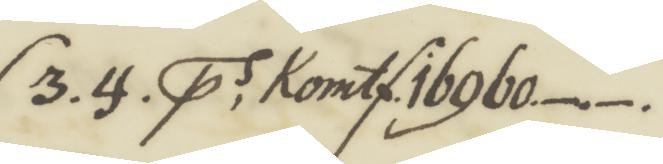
3.4. p,s komt ƒ.16960.—.—.
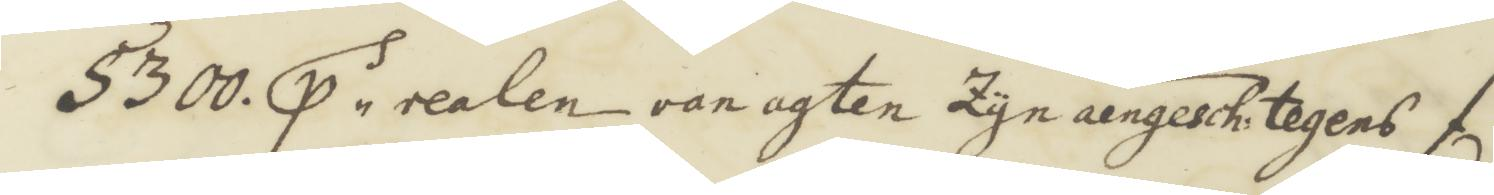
5300. p„s realen van agten zijn aengesch: tegens ƒ
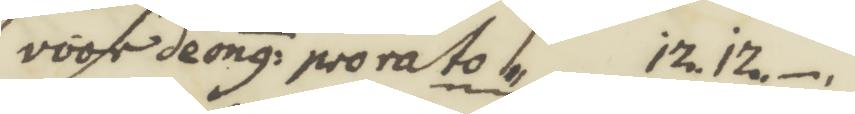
voor de ong: pro rato „ 12.12.—.
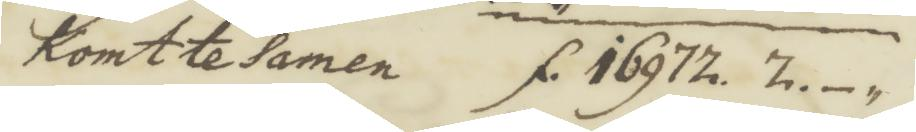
komt te samen ƒ. 16912. 2. — „
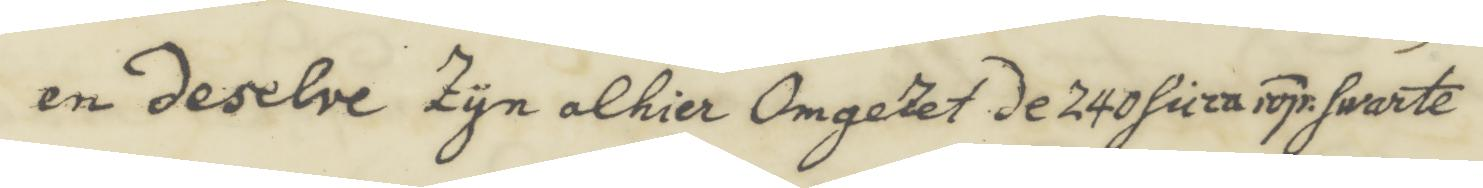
en deselve zijn alhier Omgezet de 240 sicca rop: swarte
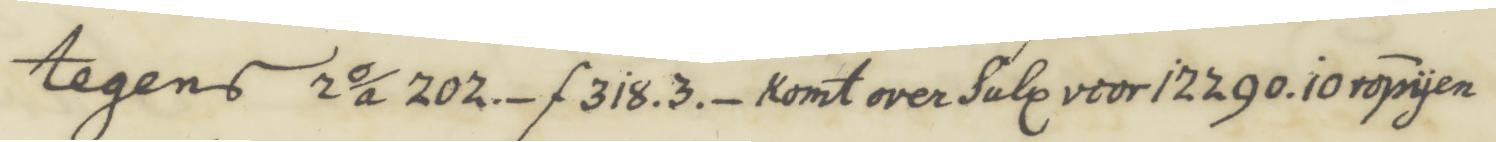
tegens ro/a 202.– ƒ318.3.– komt over sulx voor 12290. 10 ropijen
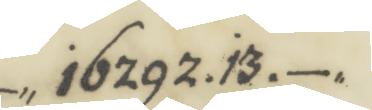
„ 16292.13.—„
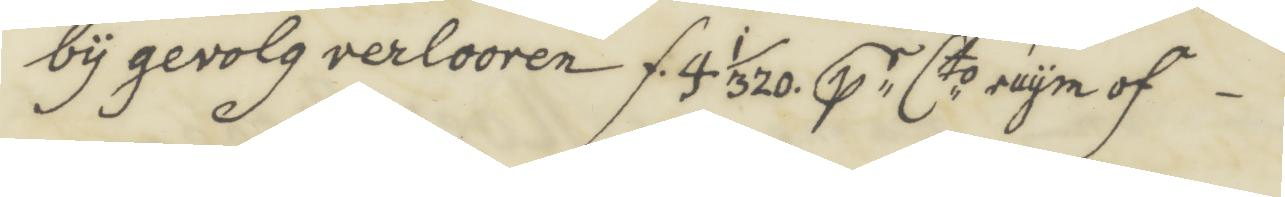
bij gevolg verlooren ƒ.4 1/320. p„rC„to ruijm of –
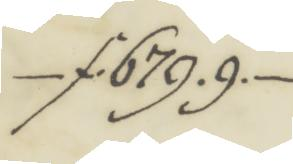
—ƒ.679.9.—
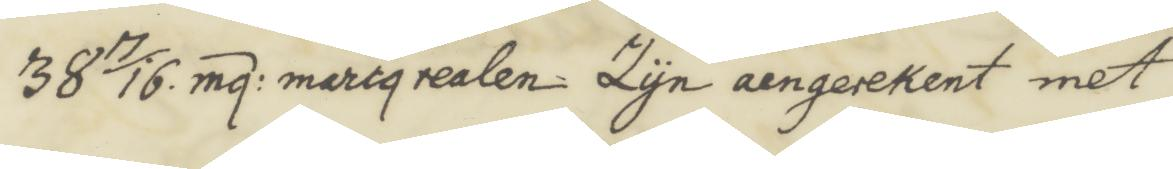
38 7/16. mq: marcq realen zijn aengerekent met
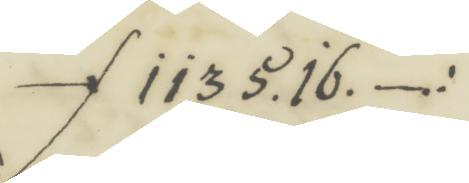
—ƒ 1135.16. —:
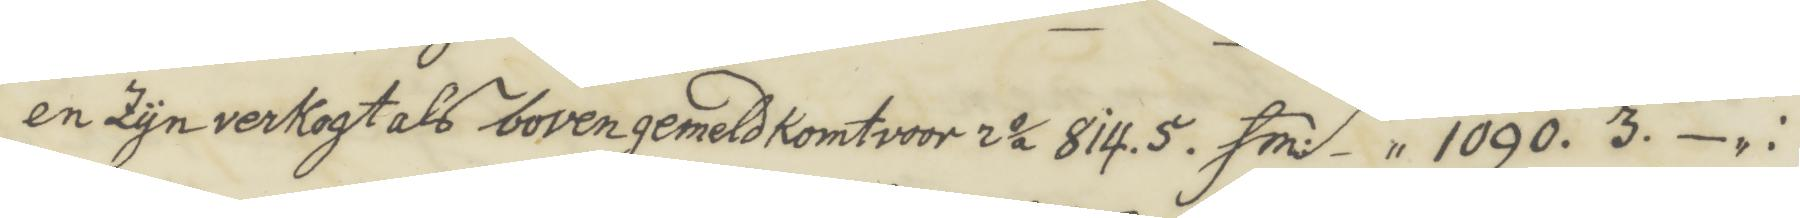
en zijn verkogt als bovengemeld komt voor ro/a 814. 5. sm: – „ 1090. 3. — „ :
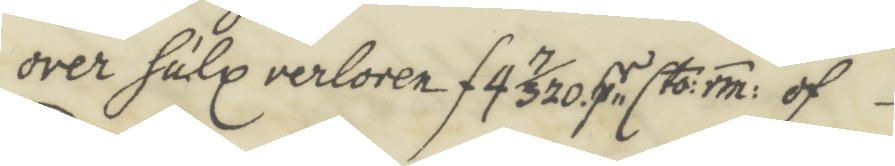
over sulx verloren ƒ4 7/320. p„rCto: rm: of
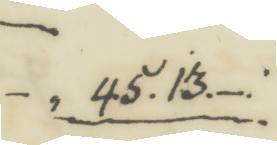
– „ 45.13.—.
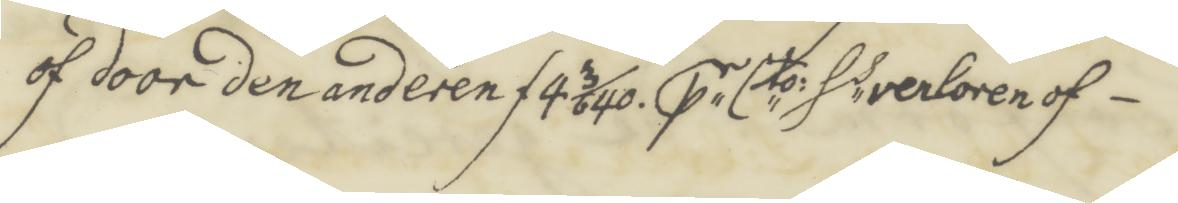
of door den anderen ƒ4 3/640. p„rC„to: s:s verloren of –
